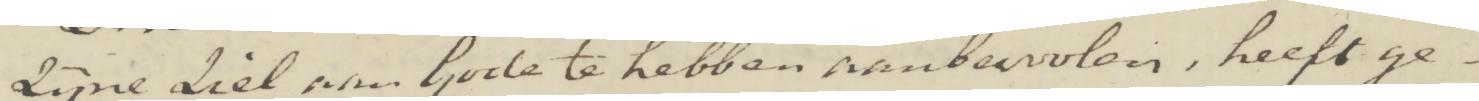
zijne Ziel aan Gode te hebben aanbevolen, heeft ge
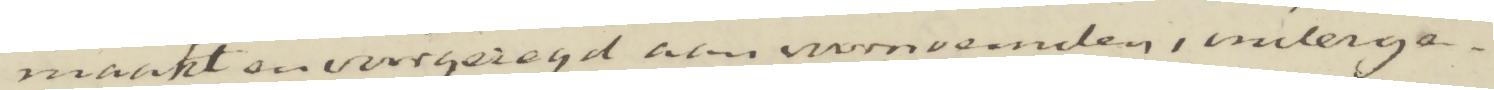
maakt en voorgezegd aan voornoemden, onderge=
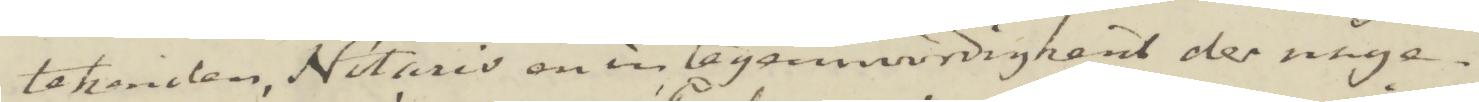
tekenden, Notaris en in tegenwoordigheid der nage
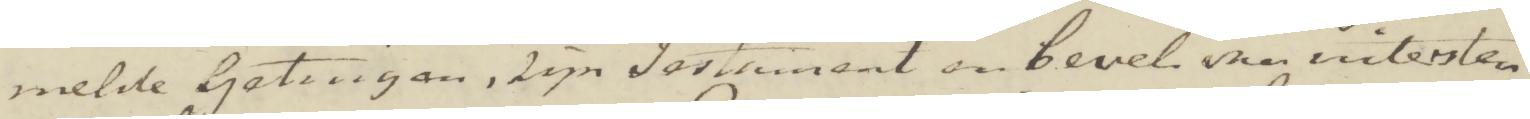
melde Getuigen, zijn Testament en bevel van uitersten
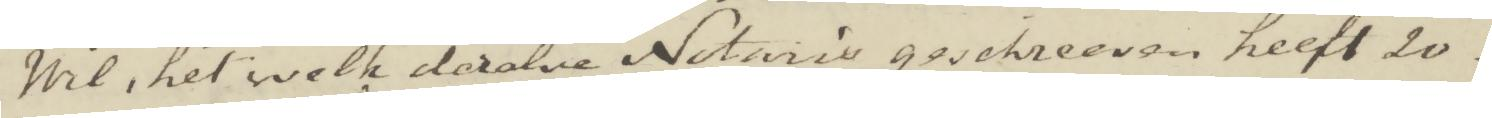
Wil, het welk dezelve Notaris geschreeven heeft zo
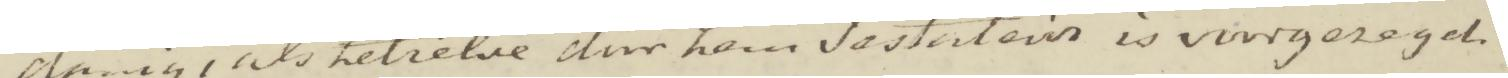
danig, als hetzelve door hem Testateur is voorgezegd.
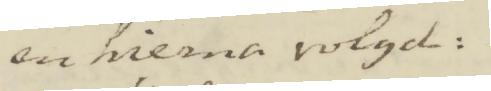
en hierna volgd:
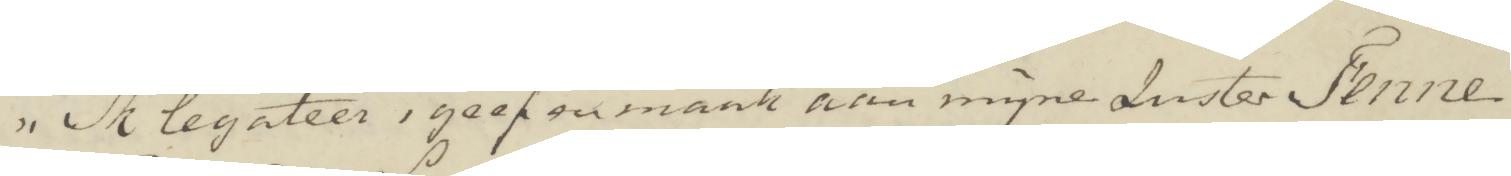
„ Ik legateer, geef en maak aan mijne Zuster Fenne
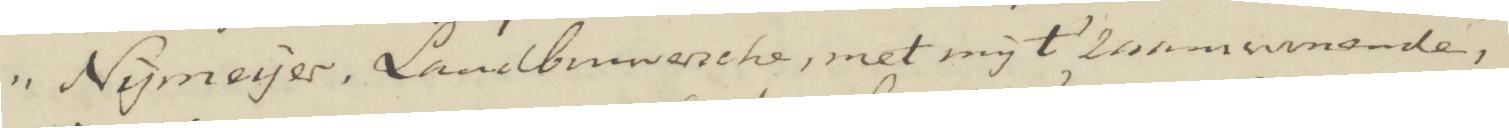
„ Nijmeijer, Landbouwersche, met mij t' zaamwonende,
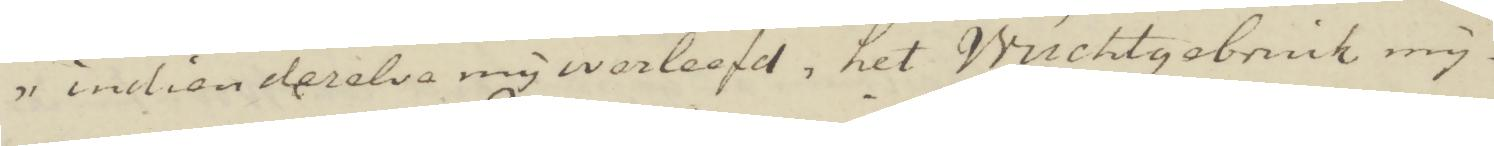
„ indien dezelve mij overleefd, het Vruchtgebruik mij
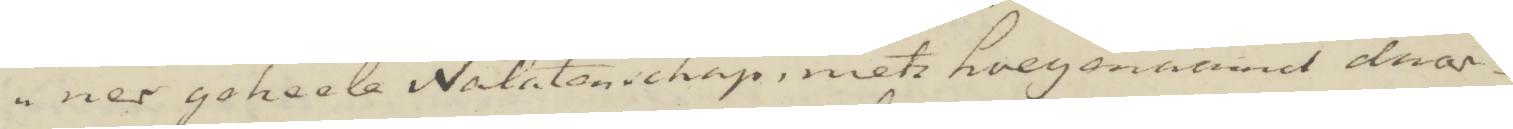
„ ner geheele Nalatenschap, niets hoegenaamd daar
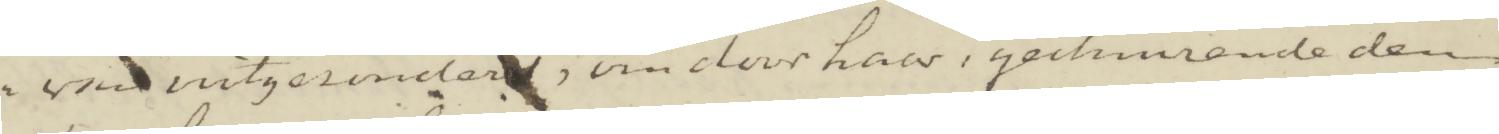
van uitgezonderd van door haar, geduurende den
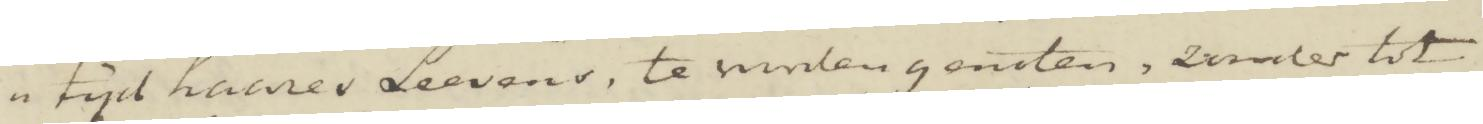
tijd haarer Leevens, te worden genoten, zonder tot
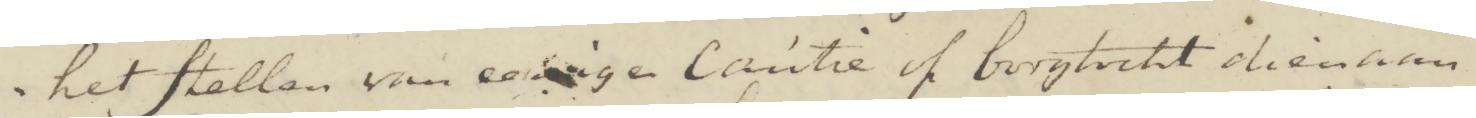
„ het stellen van eenige Cautie of borgtocht dien aan
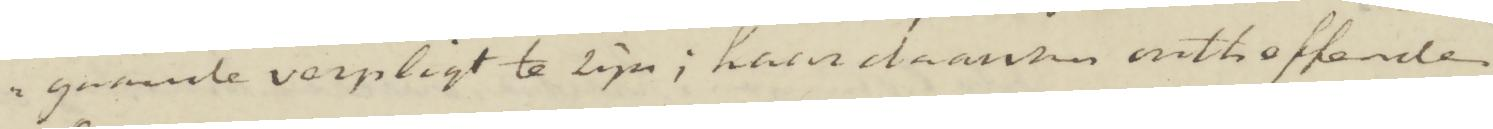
„gaande verpligt te zijn; haar daar van ontheffende
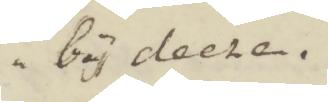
„ bij deeze.
